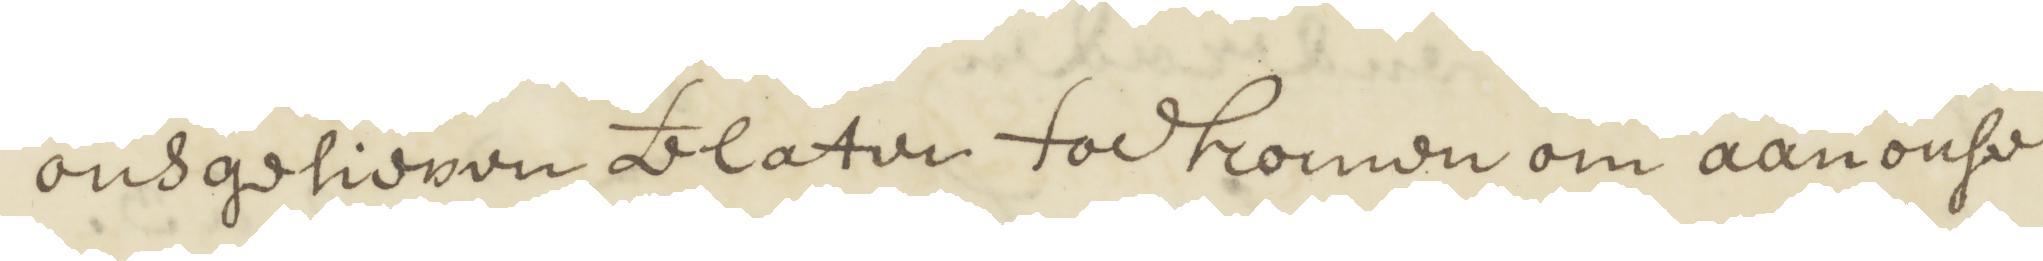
ons gelieven telaten toekomen om aan onse
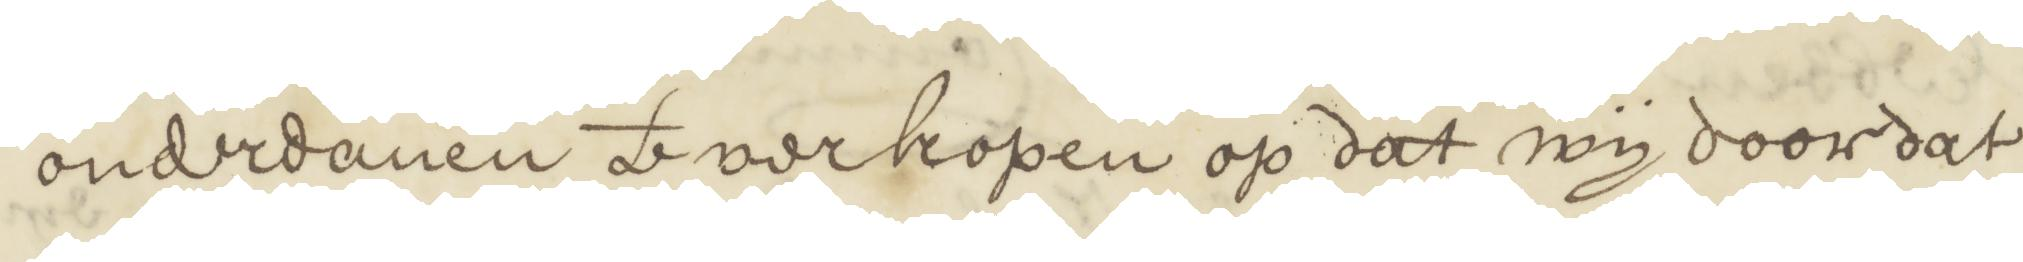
onderdanen te verkopen op dat wij door dat
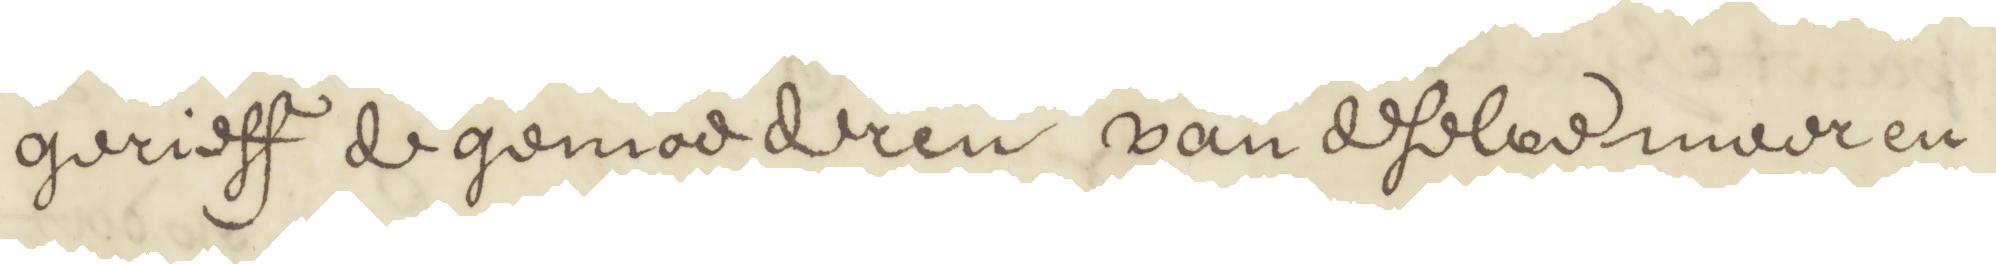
gerieff de gemoederen van deselve meer en
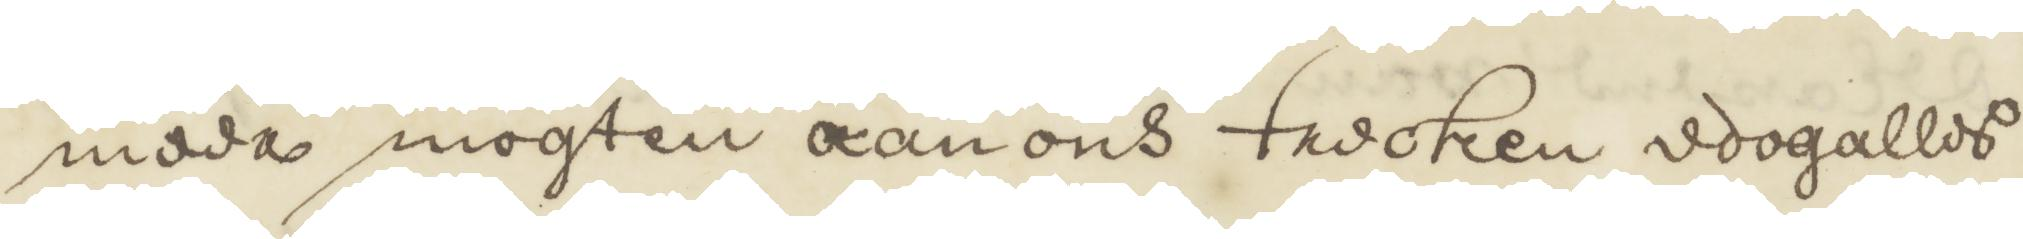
meer mogten aan ons trecken edog alles
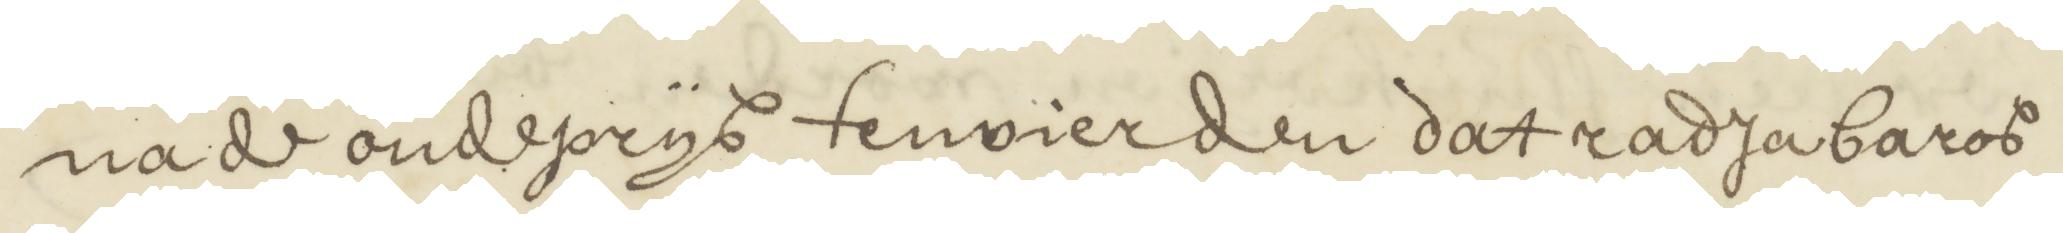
na de oudeprijs tenvierden dat radja baros
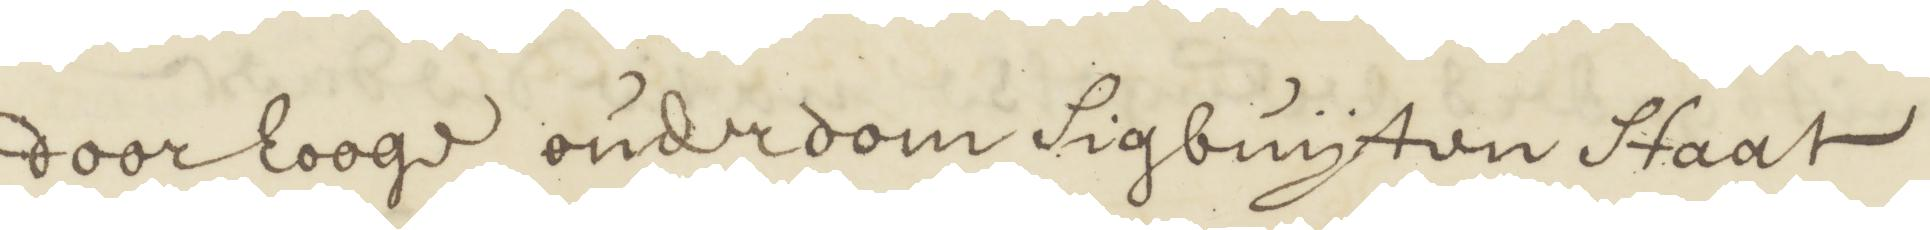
door hooge ouderdom sigbuijten staat
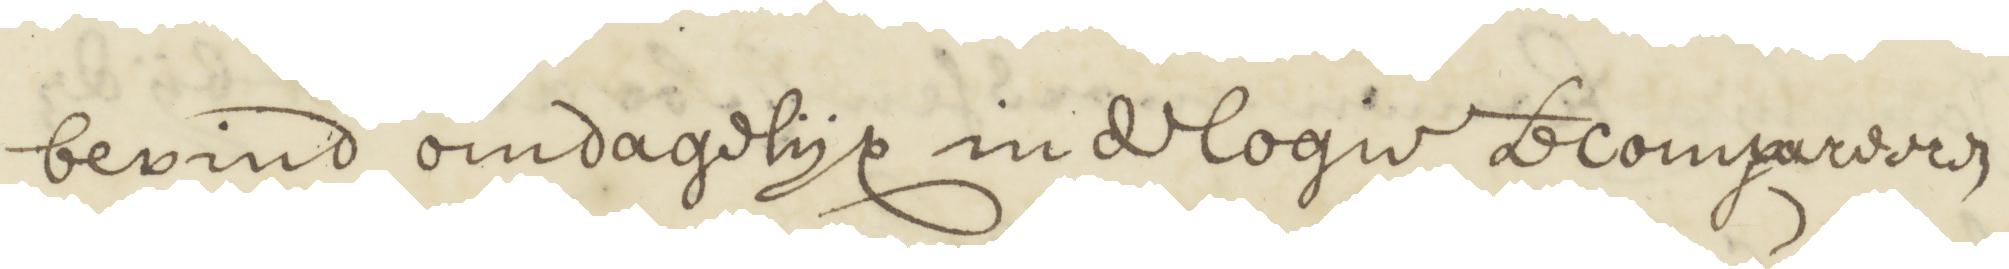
bevind om dagelijx in de logie tecompareeren
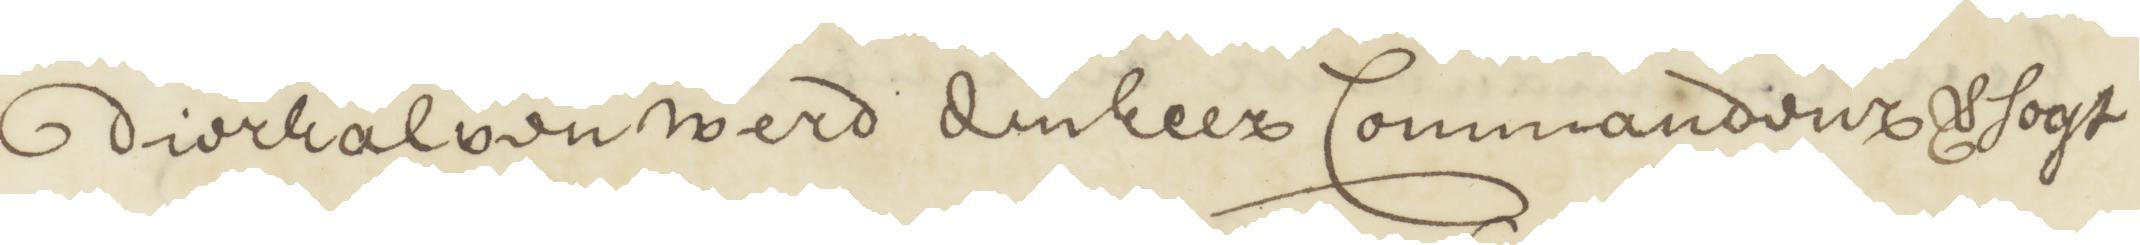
dierhalven werd den heer Commandeur versogt
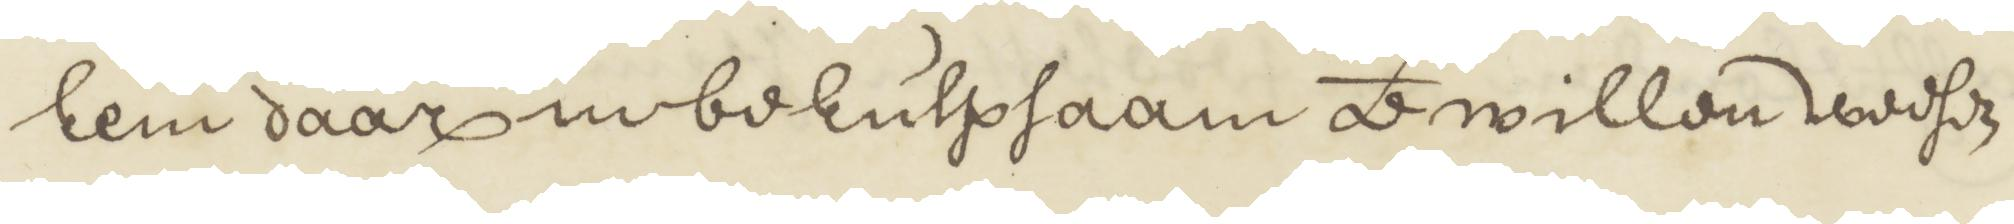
hem daar in behulpsaam te willen weesen
